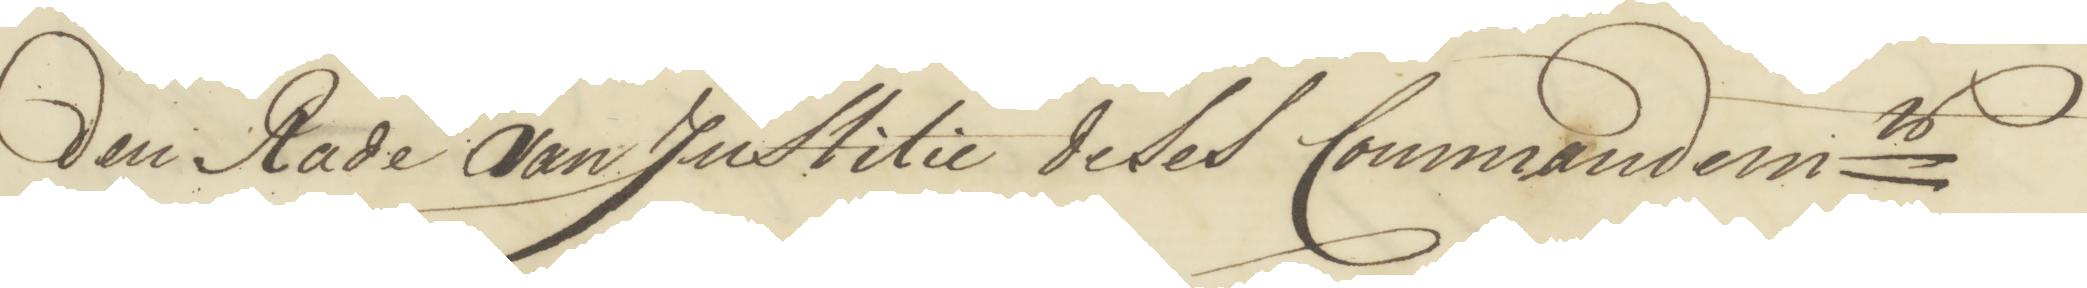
den Rade van Justitie deses Commandem=ts
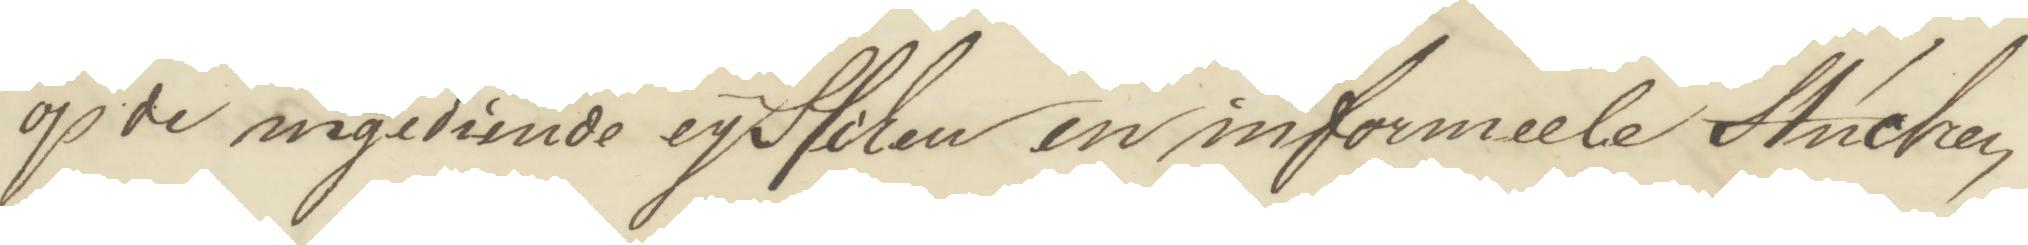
op de ingediende eijsschen en informeele stucken
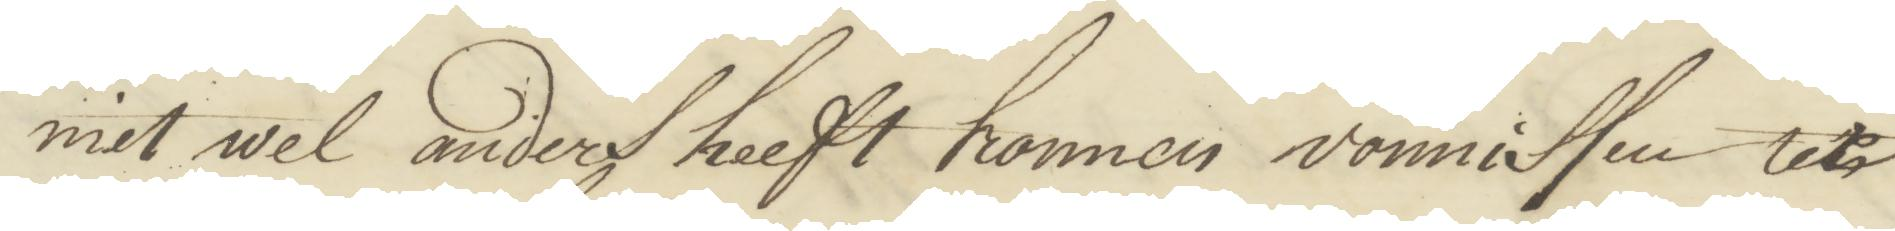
niet wel anders heeft konnen vonnissen ter
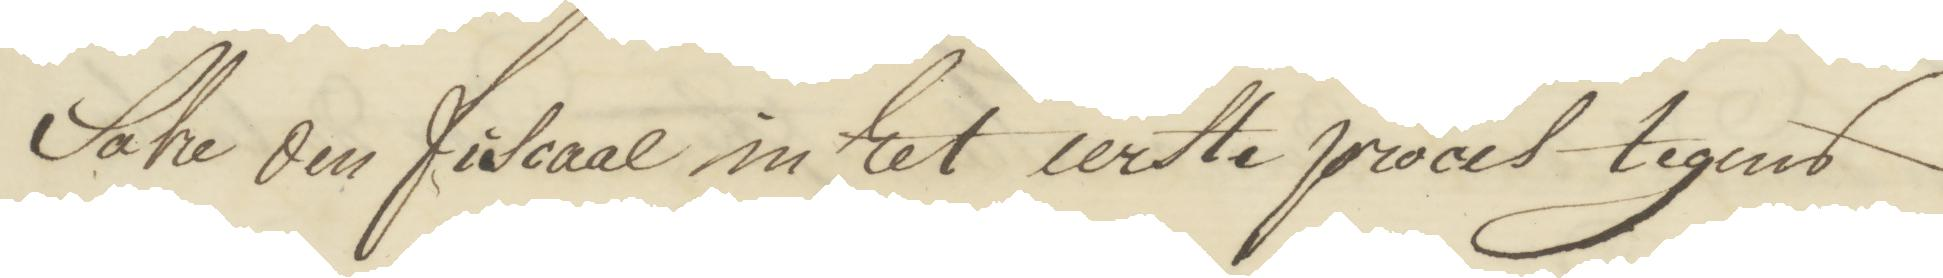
sake den fiscaal in het eerste proces tegens
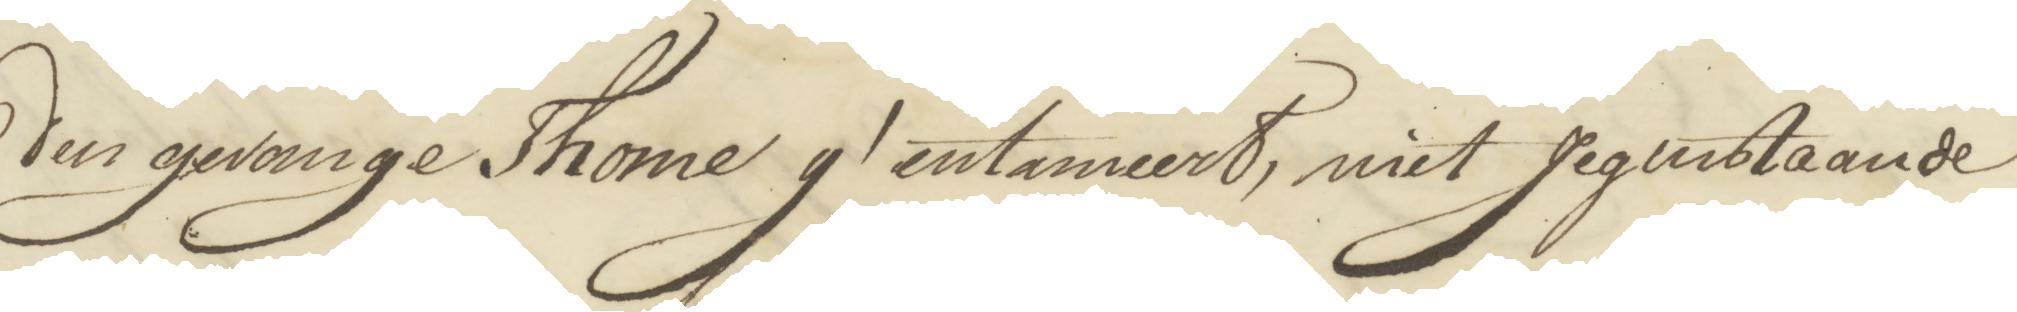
den gevange Thome g’entameert, niet Jegenstaande
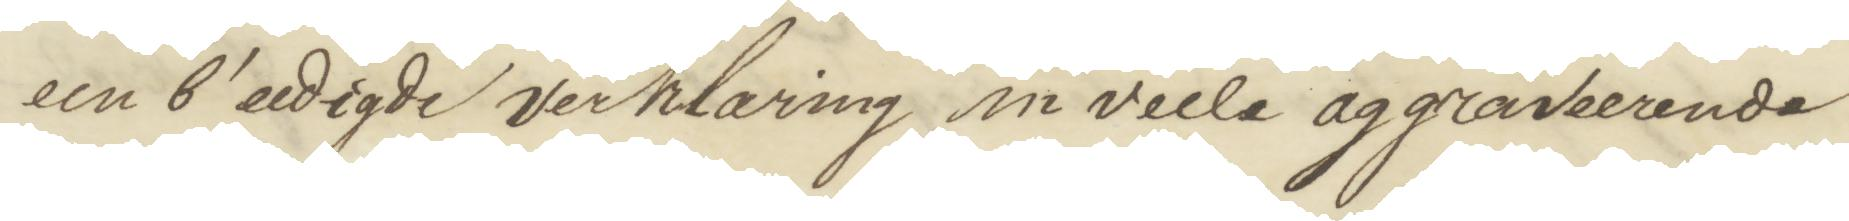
een b'eedigde verklaring in veele aggraveerende
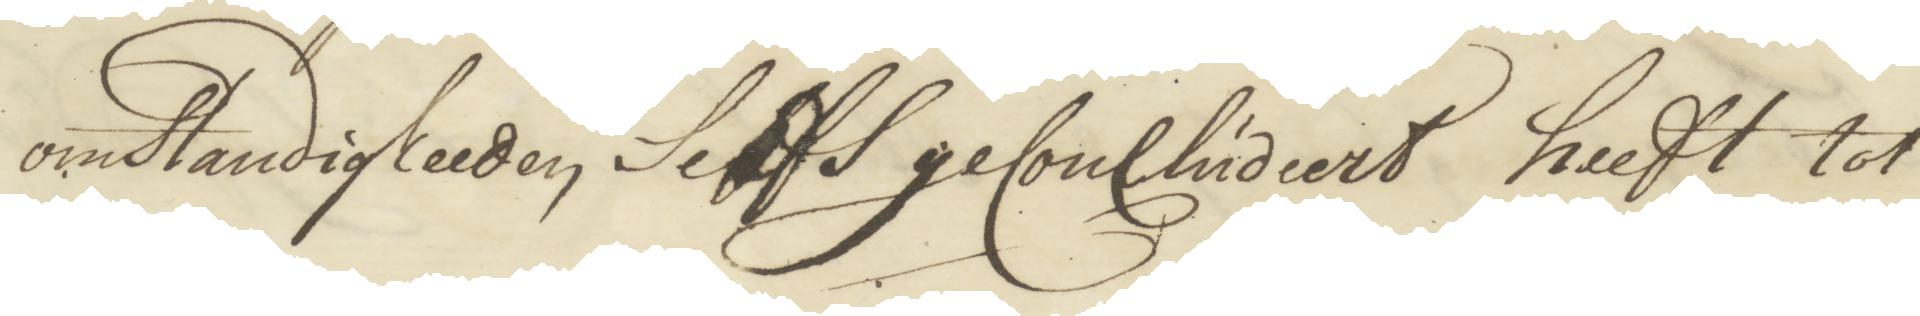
omstandigheeden selfs geconcludeert heeft tot
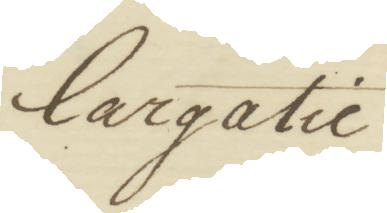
largatie
